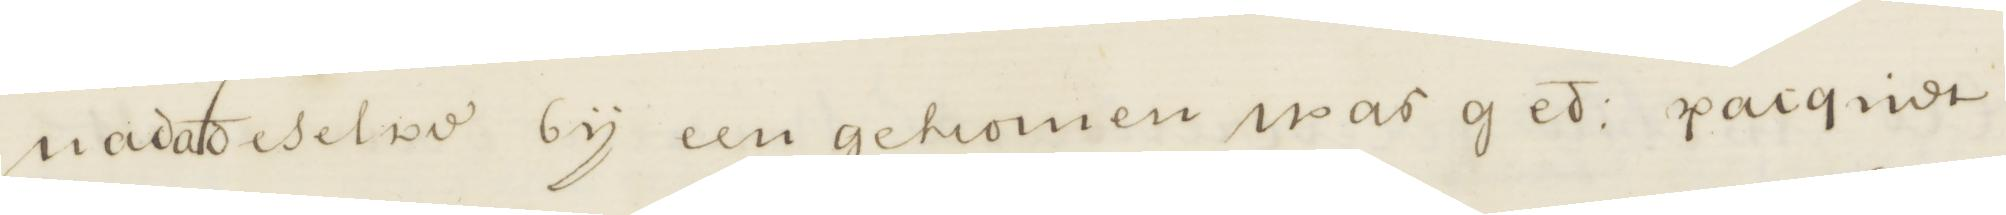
nadat deselve bij een gekomen was ged: pacquet
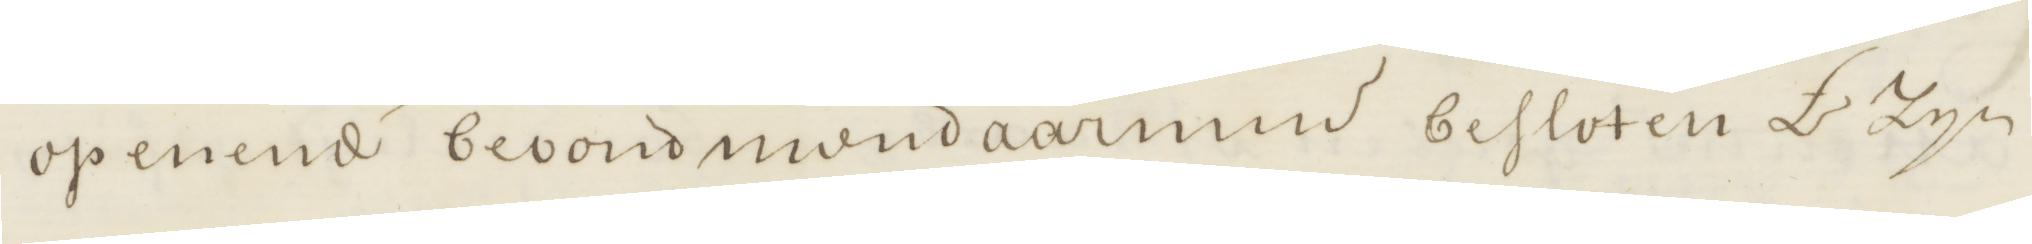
openende bevond men daarinne besloten te zyn
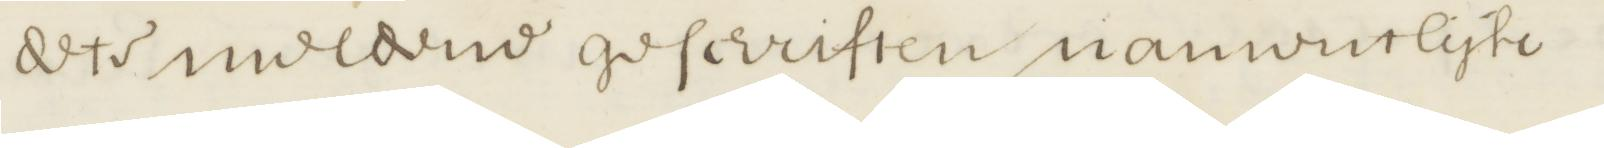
de te meldene geschriften namentlijk
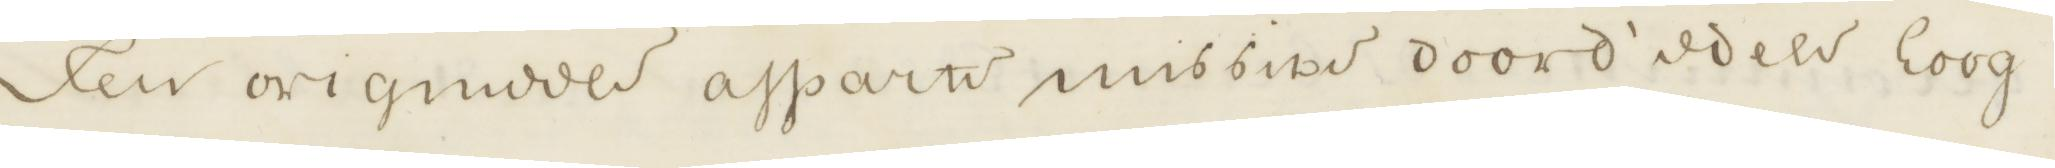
Een origineele apparte missive door d’edele hoog
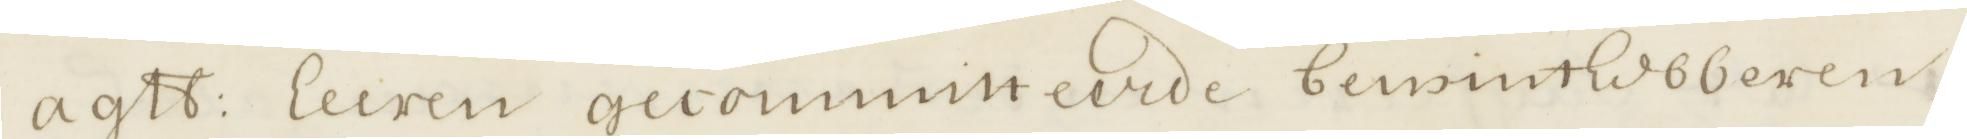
agtb: heeren gecommitteerde bewinthebberen
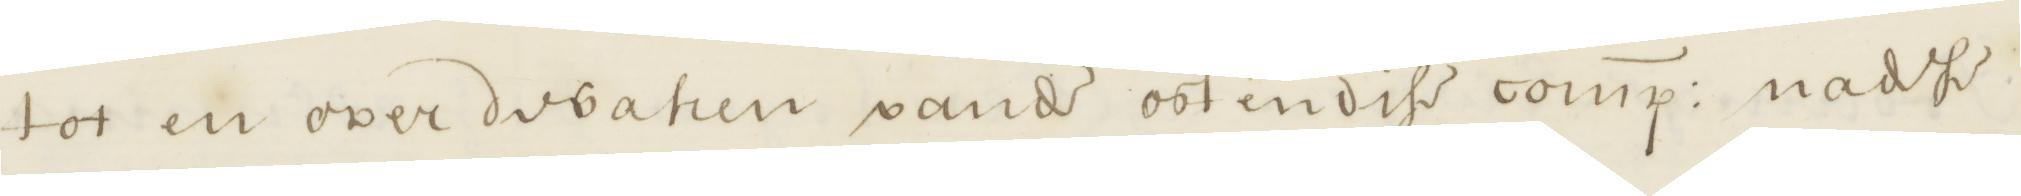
tot en over desaken vande ostendise comp: nadese
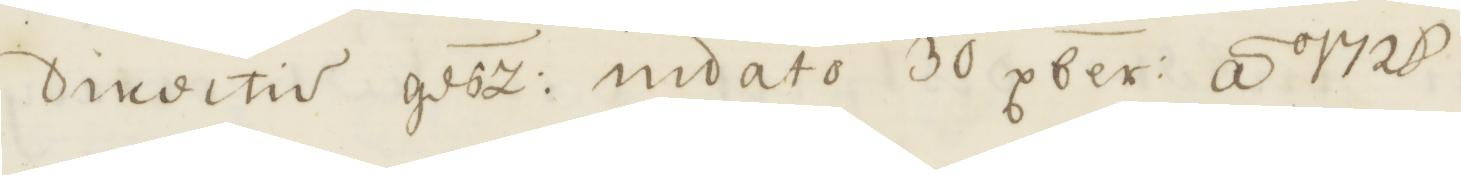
directie gesz: indato 30 xber: ao 1728
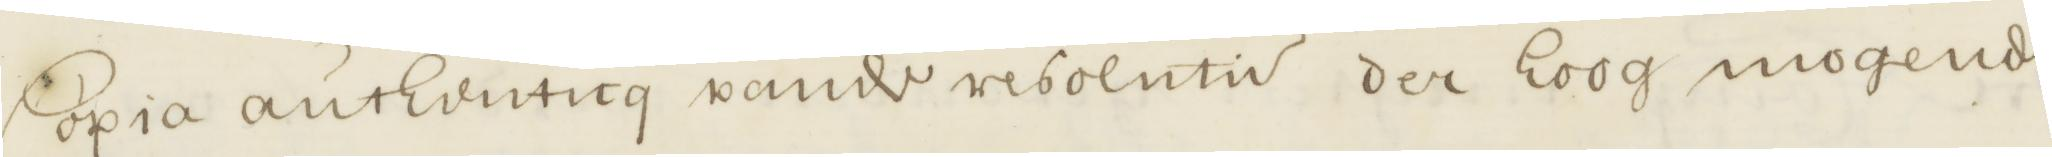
Copia authenticq vande resolutie der hoog mogende
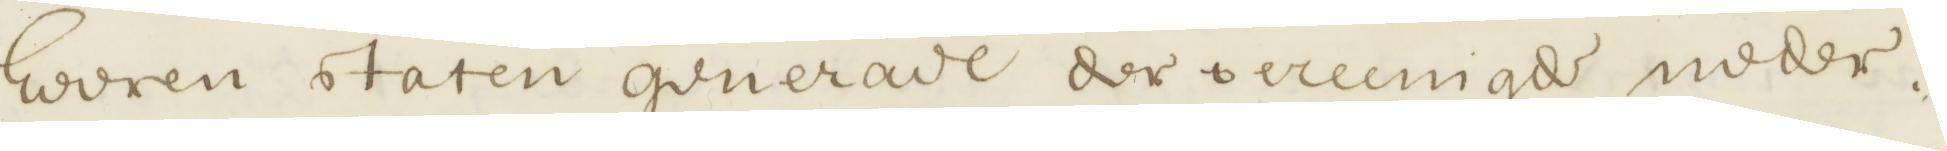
heeren staten generael der vereenigde neder„
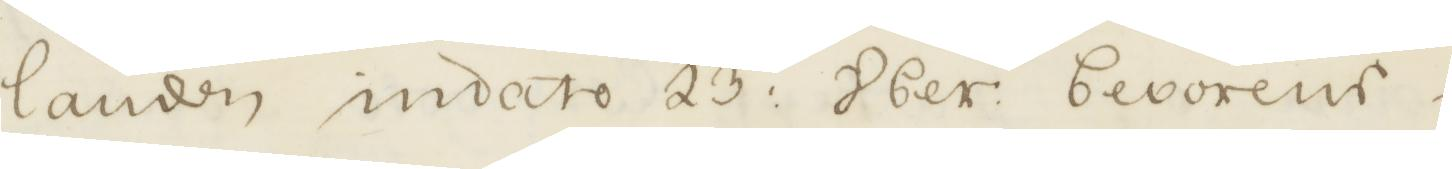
landen indato 23:' 8ber: bevorens
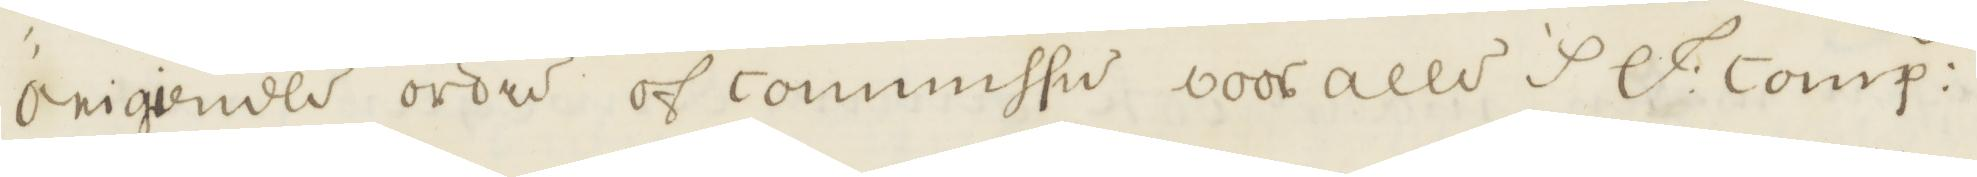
origenele ordre of commissie voor alle 'S E: Comp:s
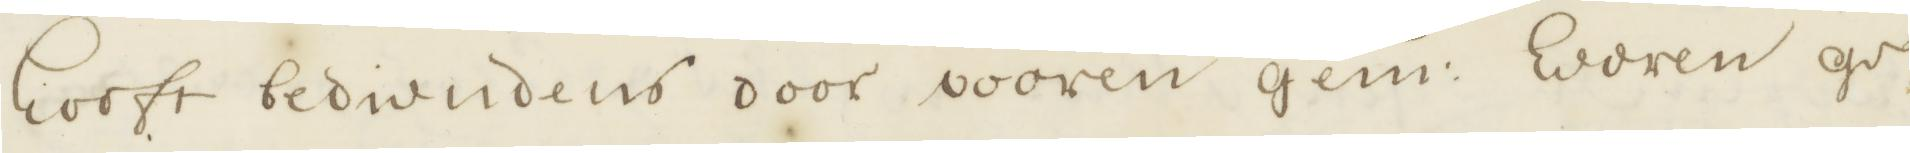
hooft bediendens door vooren gem: heeren ge„
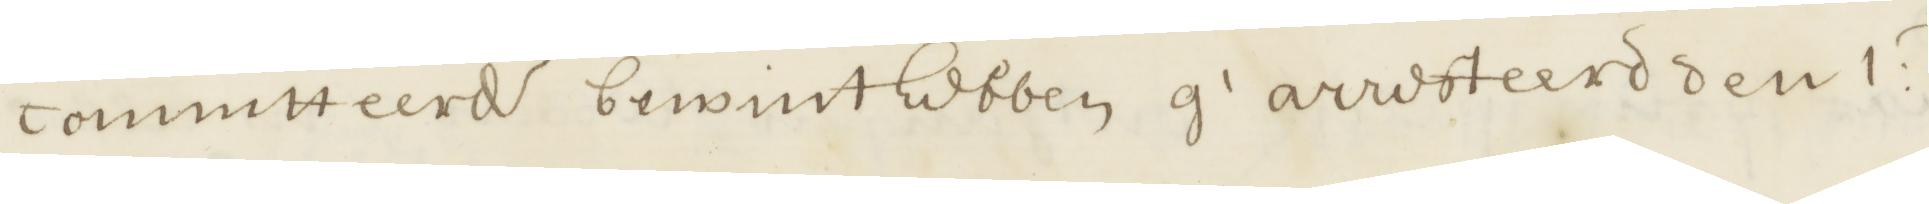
committeerde bewinthebber g’arresteerd den 1:'
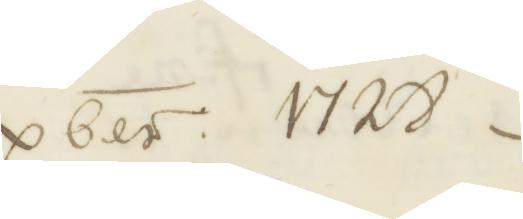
xber: 1728
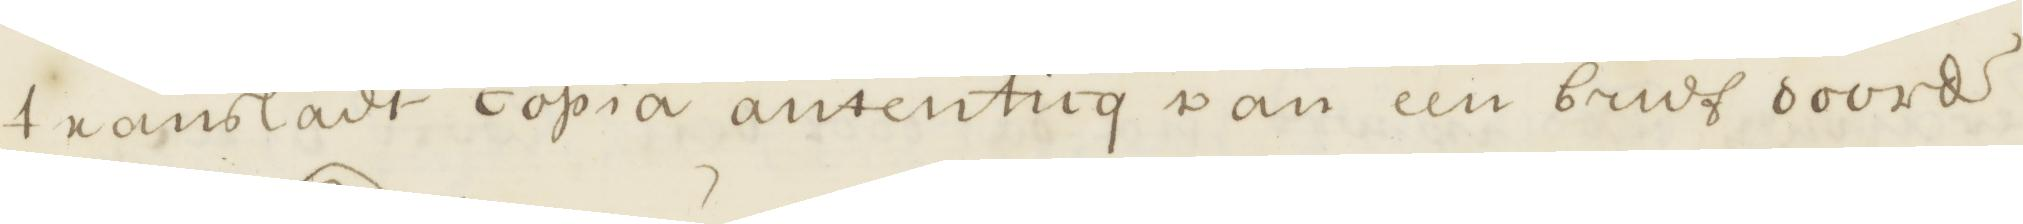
translaet copia autenticq van een brief voorde
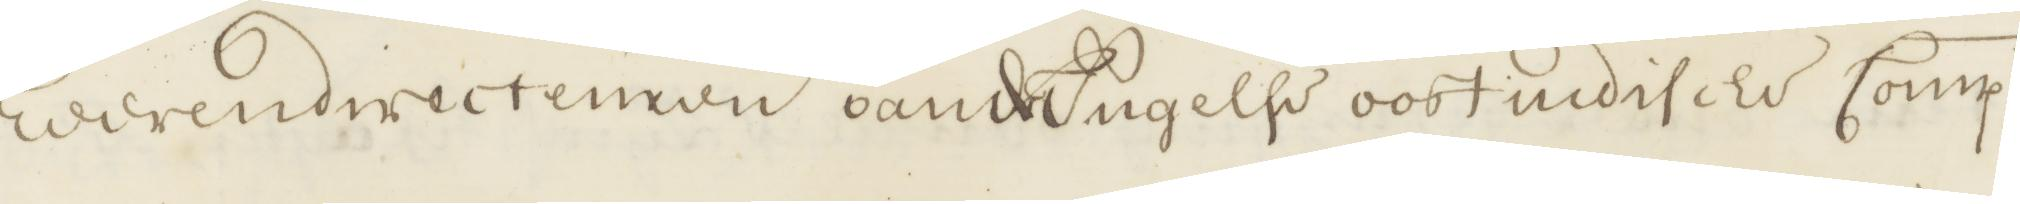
heerendirecteuren van dEngelse oost indische Comps
